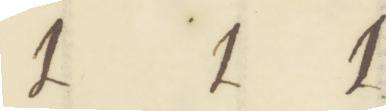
1 1 1
